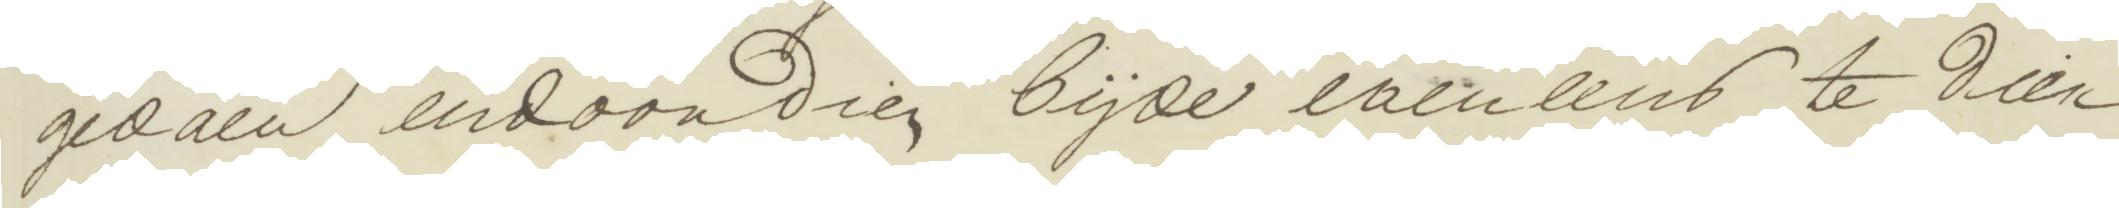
gedaen endoor dien bijde eveneens te dier
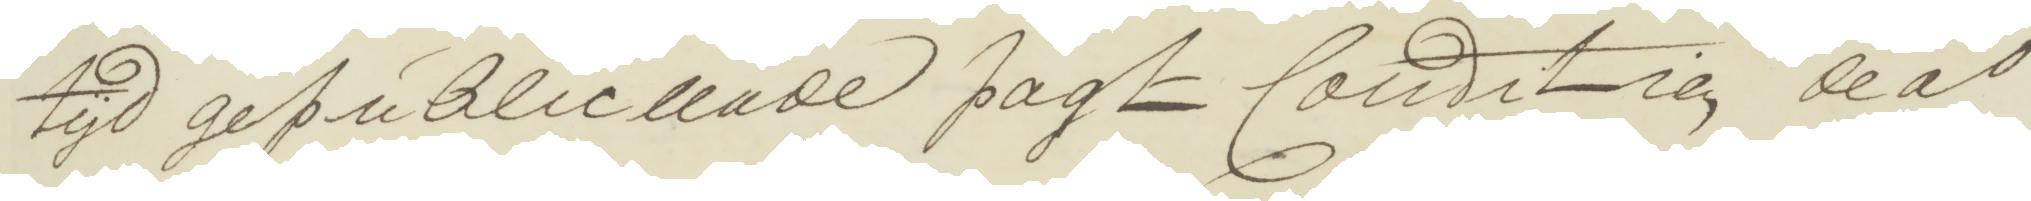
tijd gepubliceerde pagt Conditien de ao
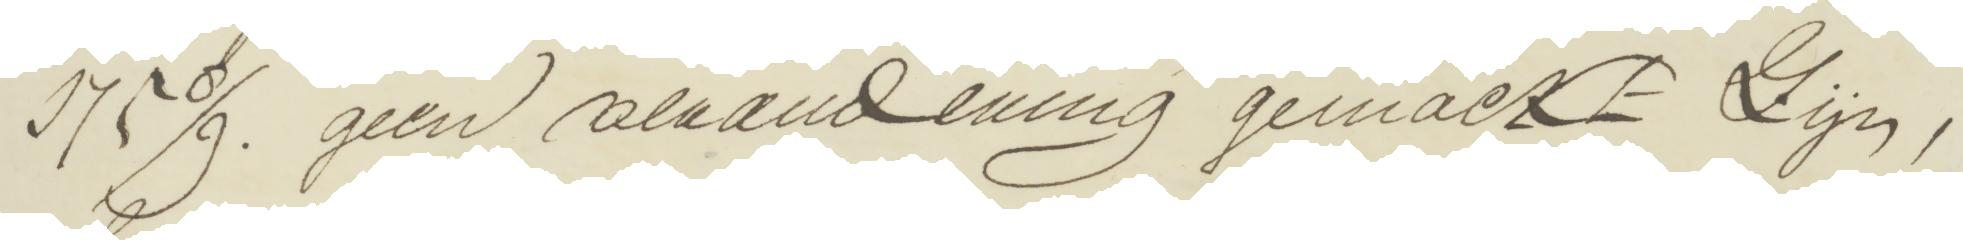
1758/9. geen verandering gemaekt zijn,
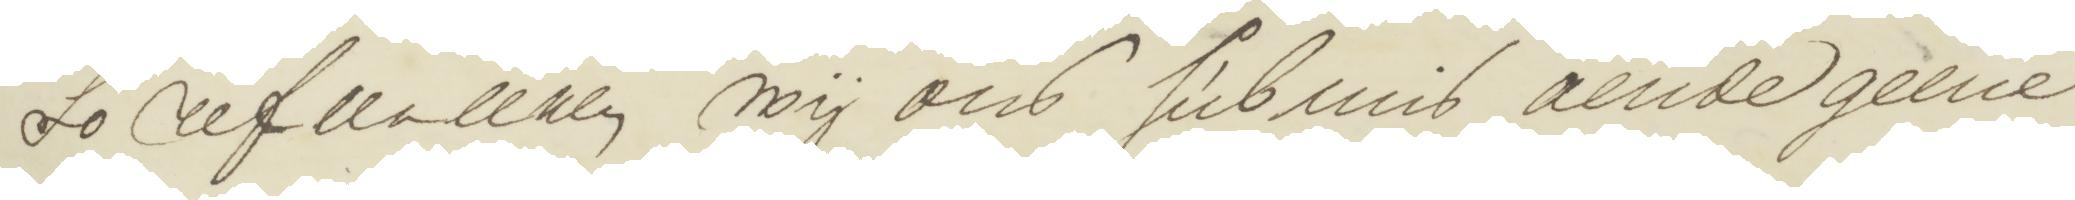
so refeereeren wij ons submis aende geene
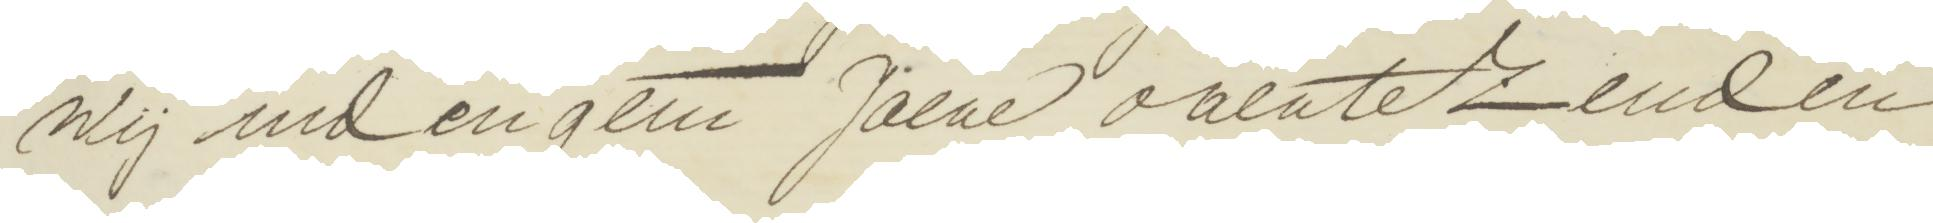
wij inden gem Jaere overtezenden
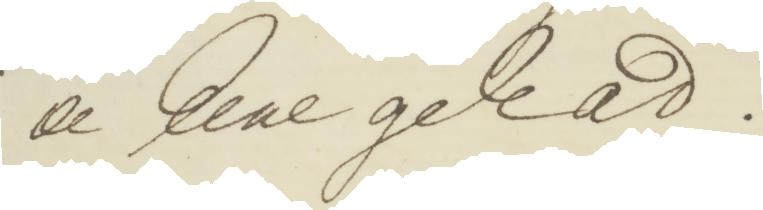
de Eere gehad.
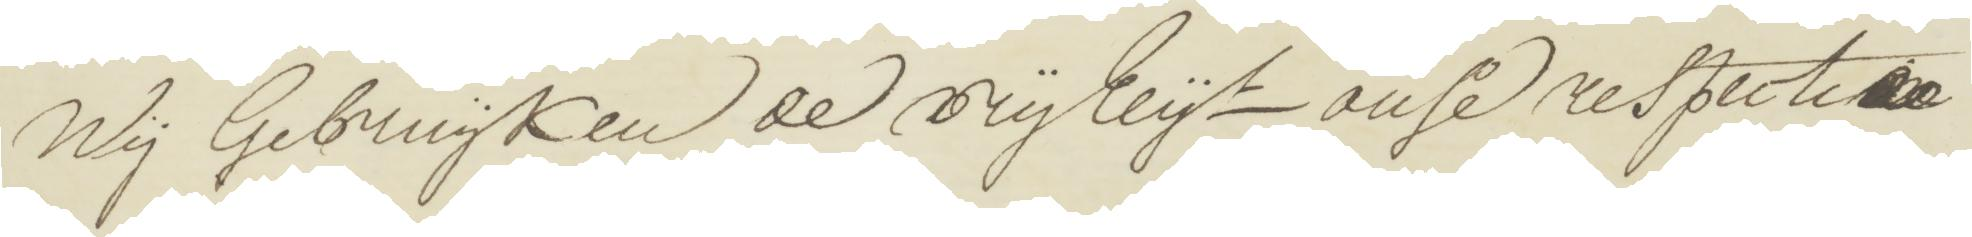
Wij gebruijken de vrijheijt onse respective
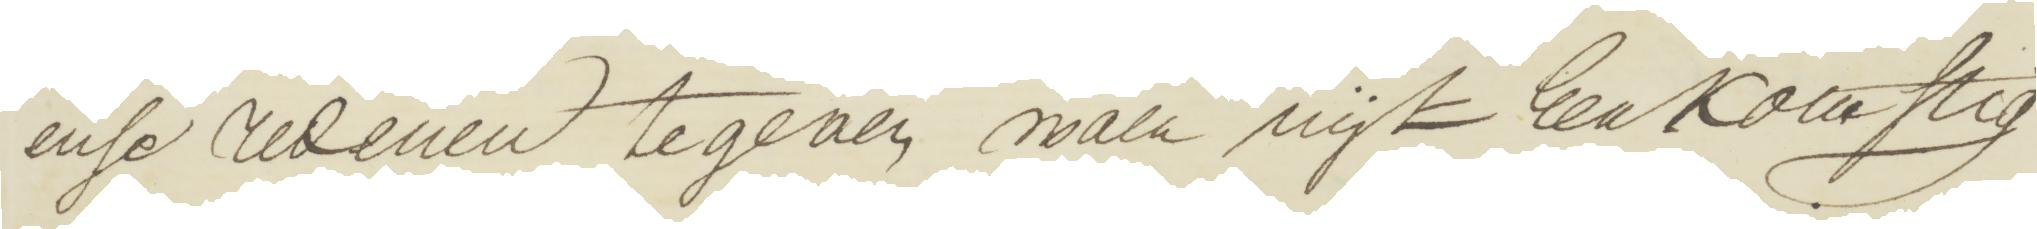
euse redenen te geven waer uijt Eerkomstig
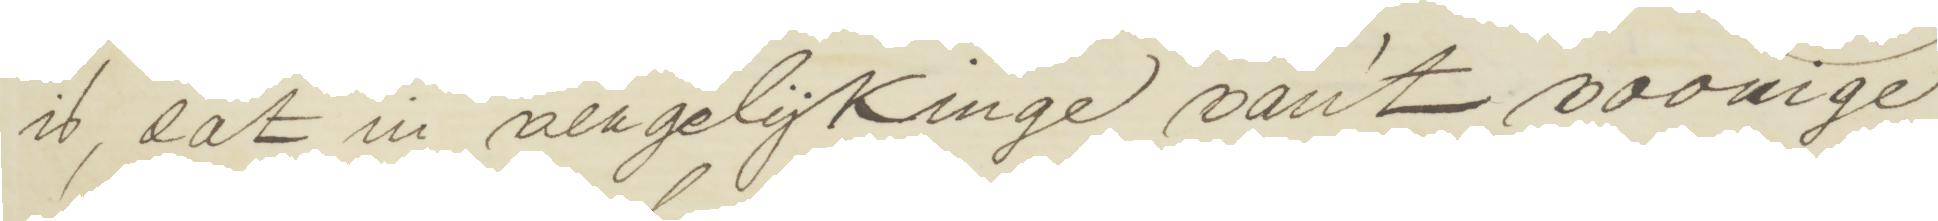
is, dat in vergelijkinge van’t voorige
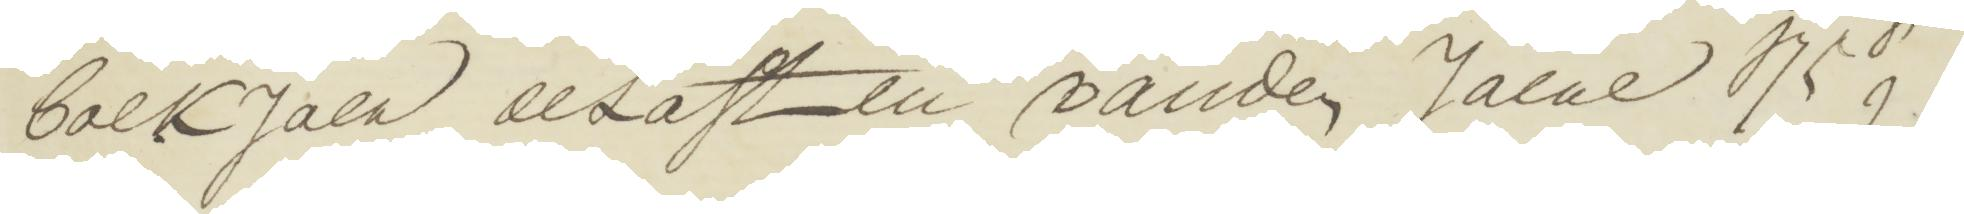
boekJaer delasten vanden Jaere 1758 9
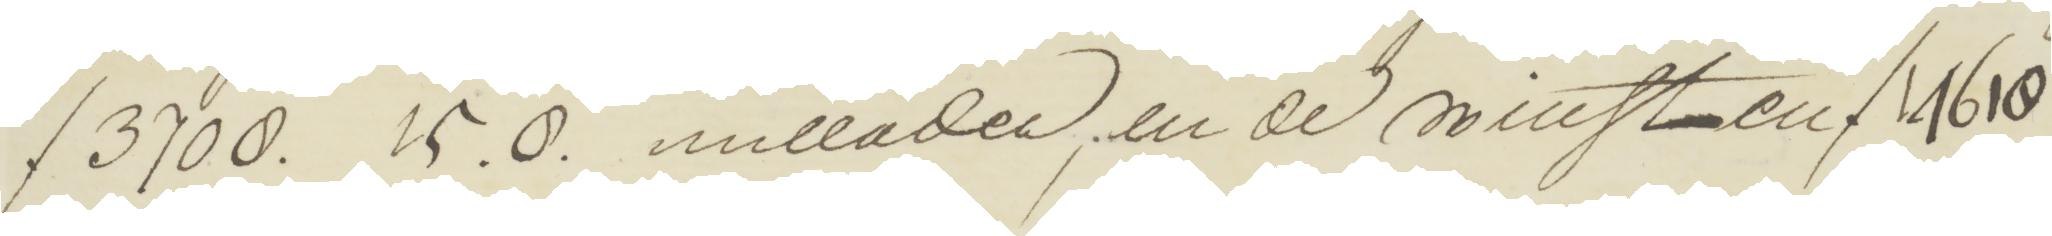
ƒ 3708. 15. 8. meerder, en de winsten ƒ 14618
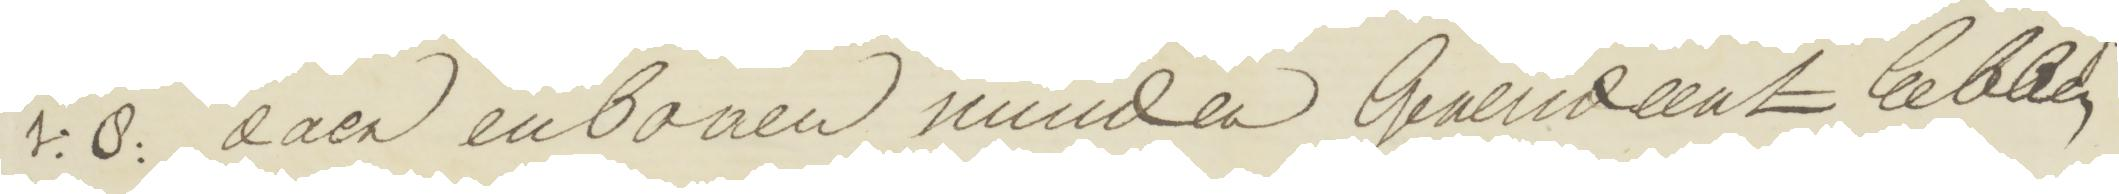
1: 8: daer enboven minder gerendeert hebben
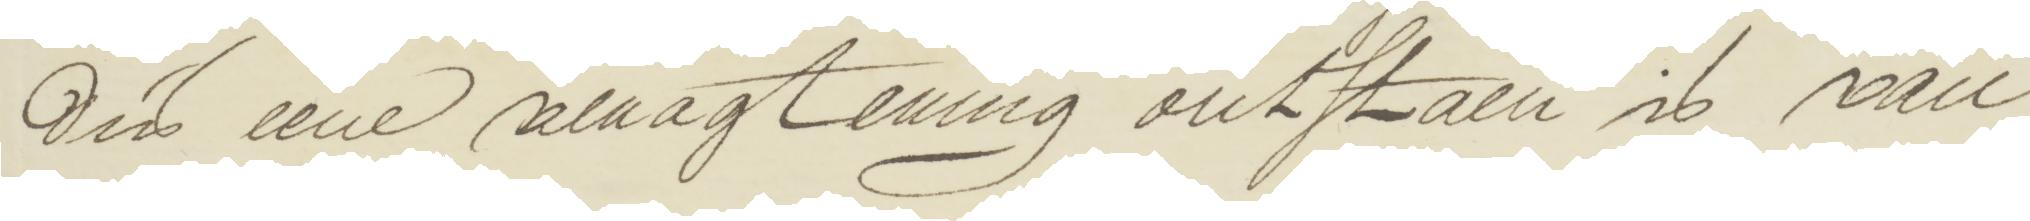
dus eene veragtering ontstaen is van
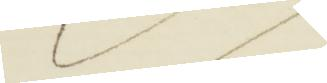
ƒ /
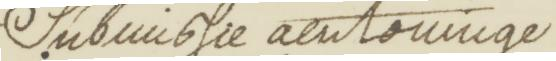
submissie aentoninge
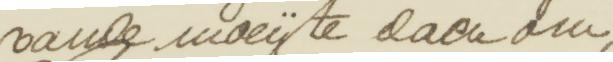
vande moeijte daer om„
